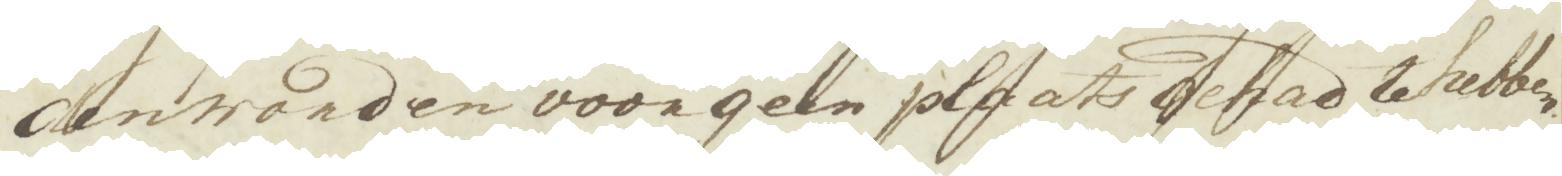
den worden voor geen plaats gehad te hebben.
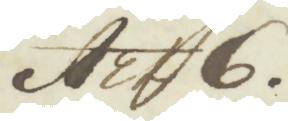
Art. 6.
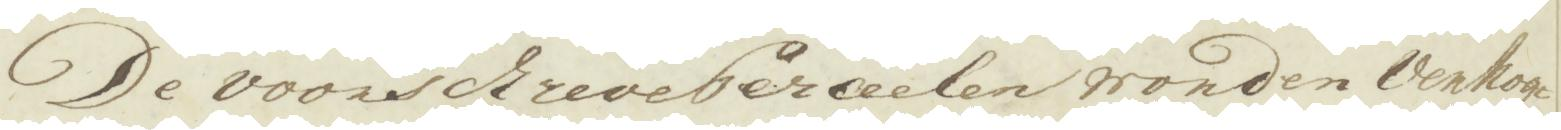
De voorschreve berceelen worden verkogt
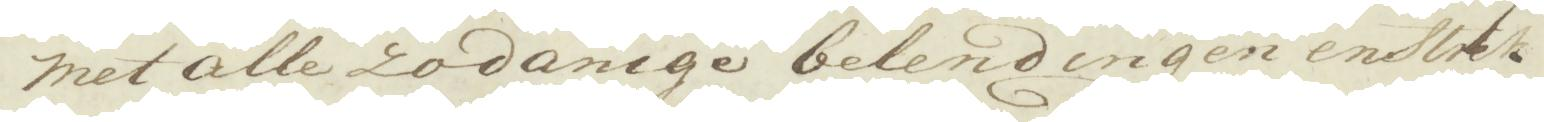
met alle zodanige belendingen en strek
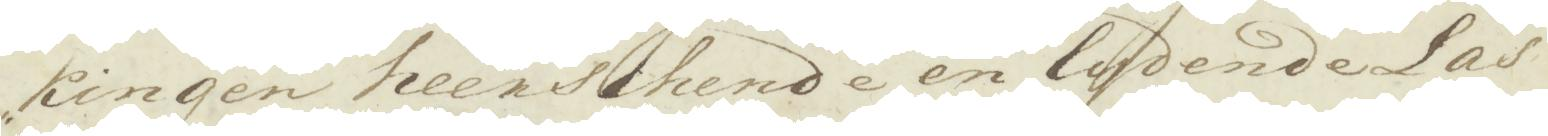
„kingen, heerschende en lydende las
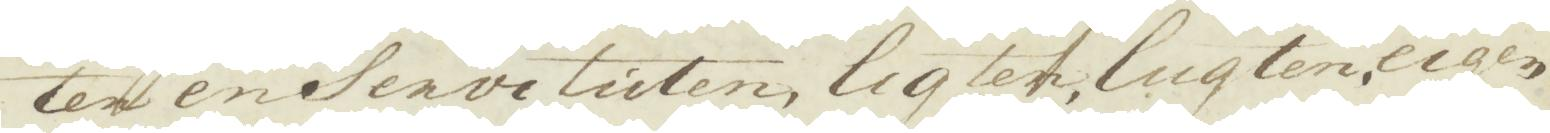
ter en servituten, ligten, lugten, eigen
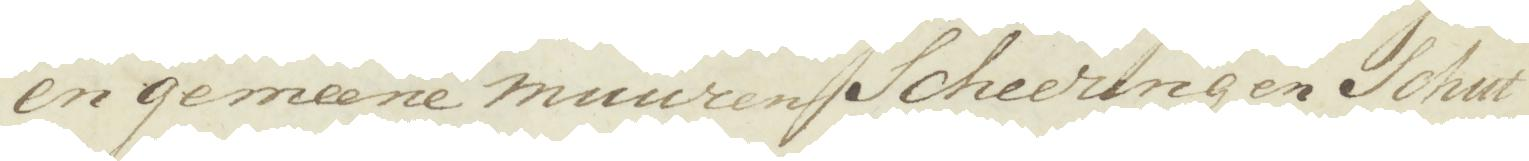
en gemeene muuren scheeringen schut
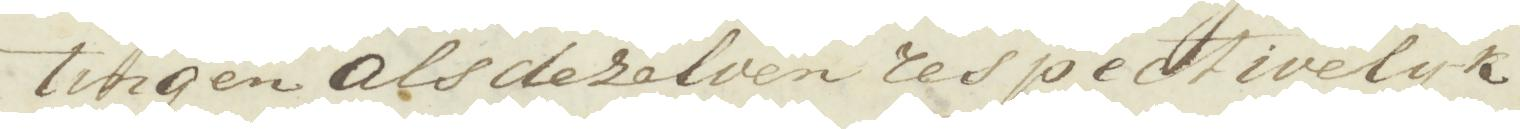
tingen als dezelven respectivelyk
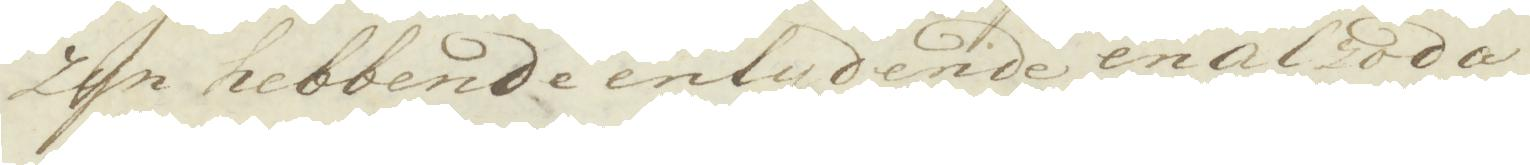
zyn hebbende enlydende en al zoda
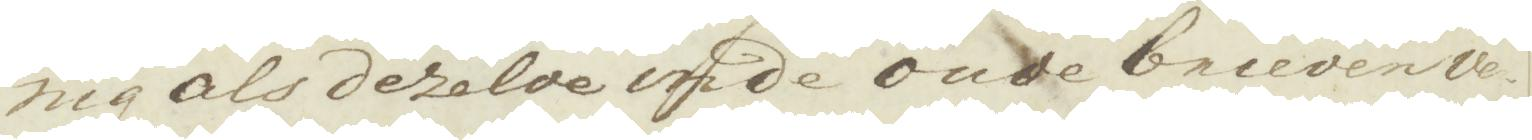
nig als dezelve in de oude brieven ver
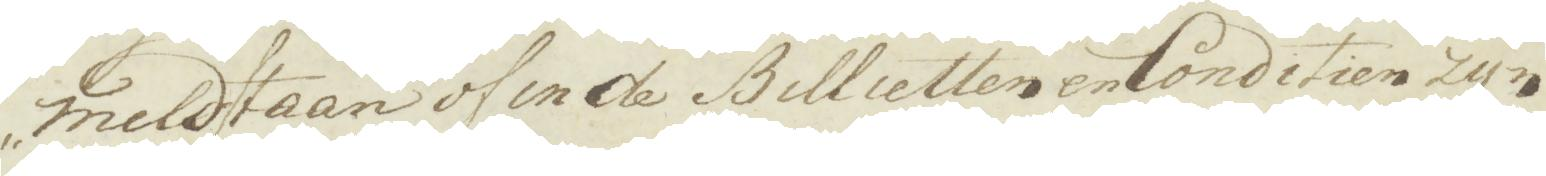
„meldstaan of in de Billietten en Conditien zyn
